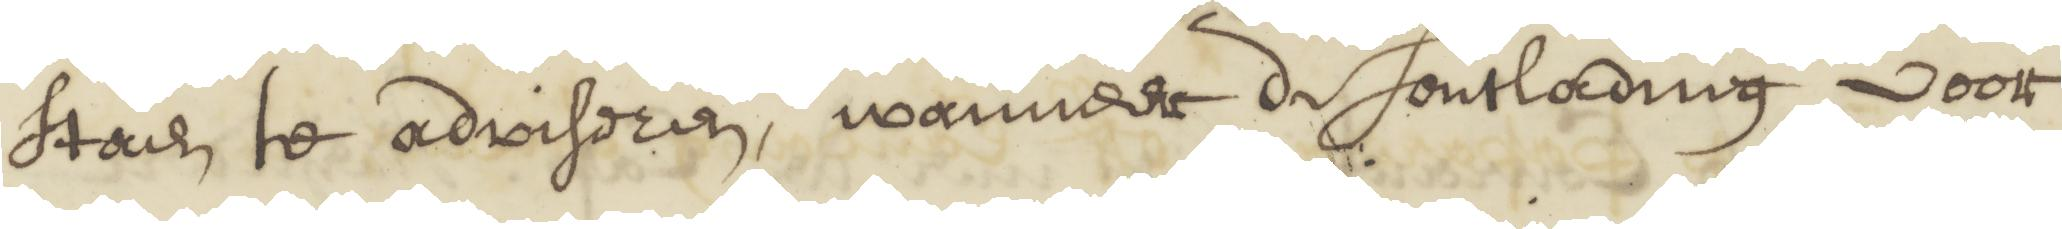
staen te adviseren, wanneer de soutlading voor
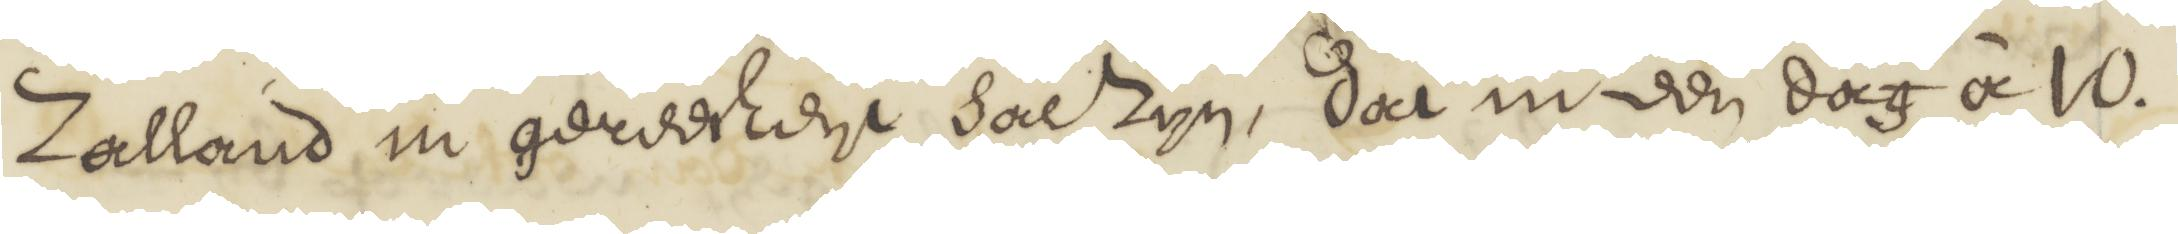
Zalland in gereetheijt sal zijn, dat in een dag â 10.
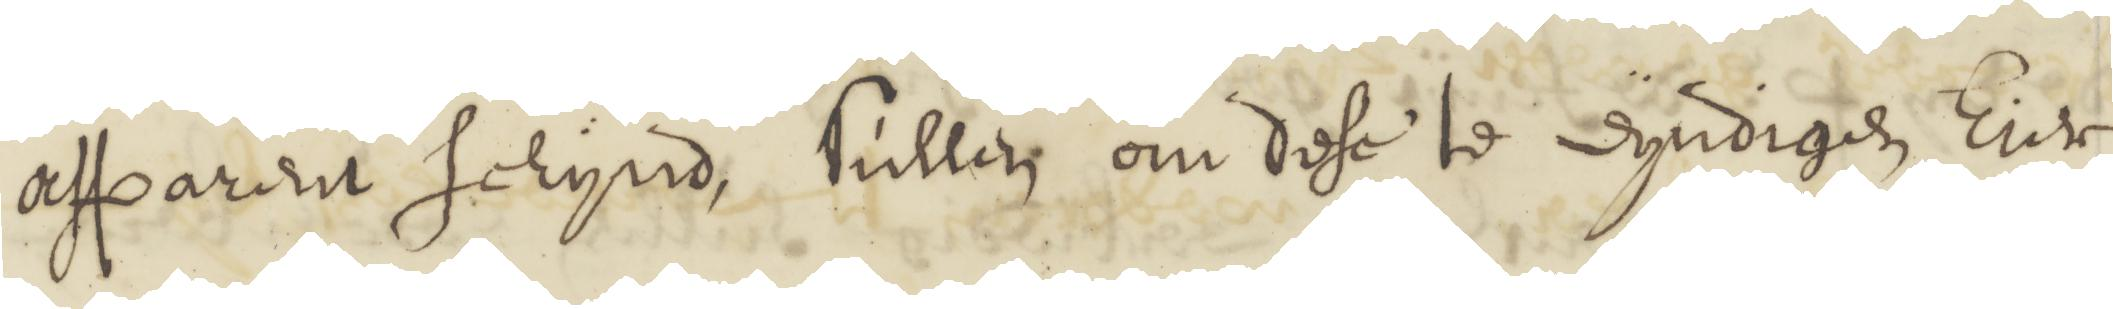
apparent schijnd, sullen om dese te eijndigen hier
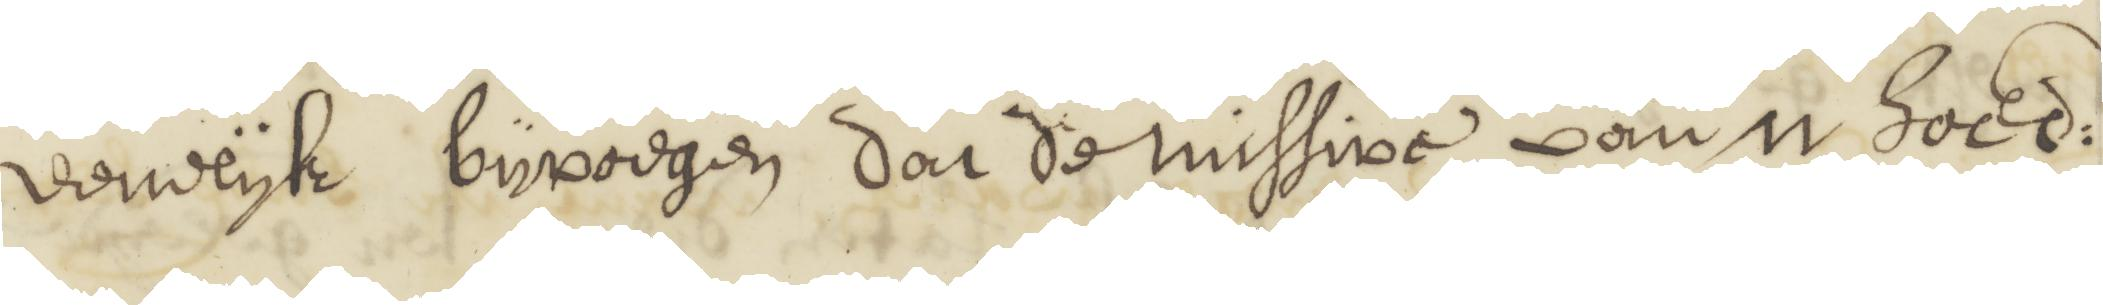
eenelijk bijvoegen dat de missive van u hoEd:
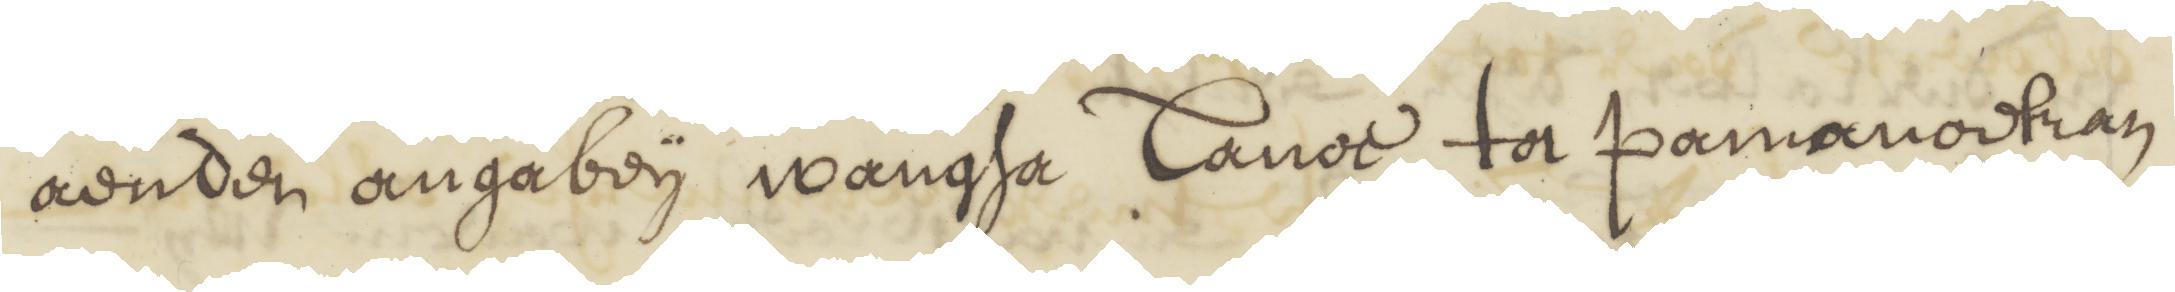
aenden angabeij wangsa Canoe tot pamanoekan
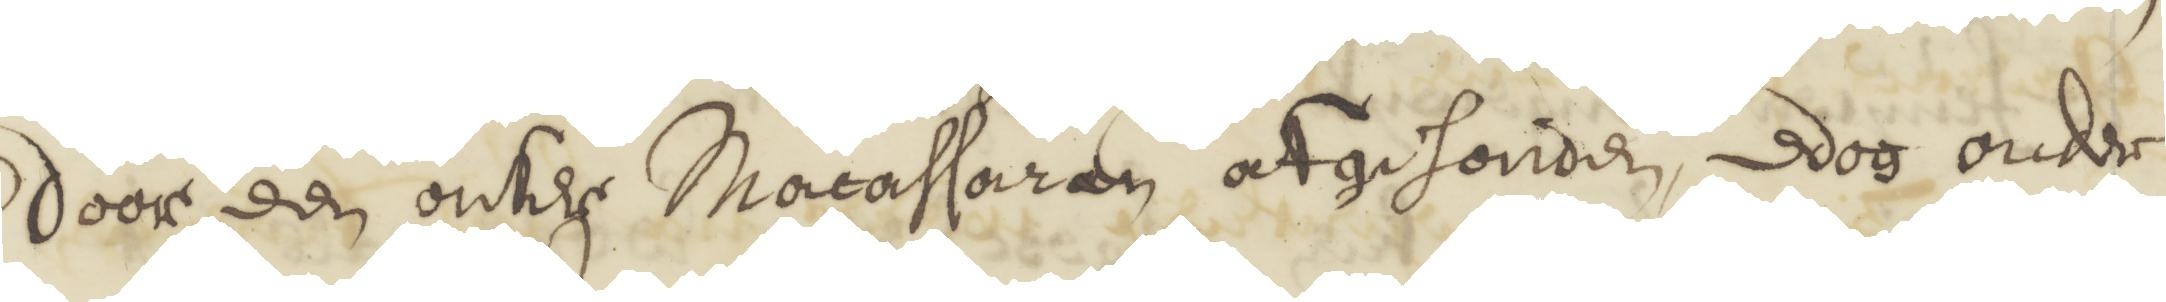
door een onser Macassaren afgesonden, edog onder
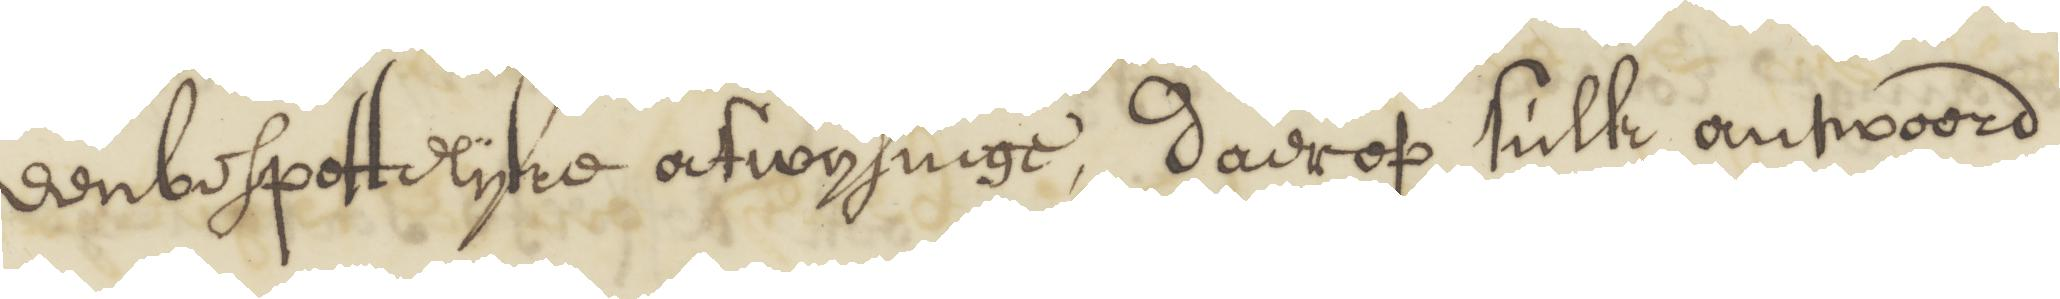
een bespottelijke afwijsinge, daerop sulk antwoord
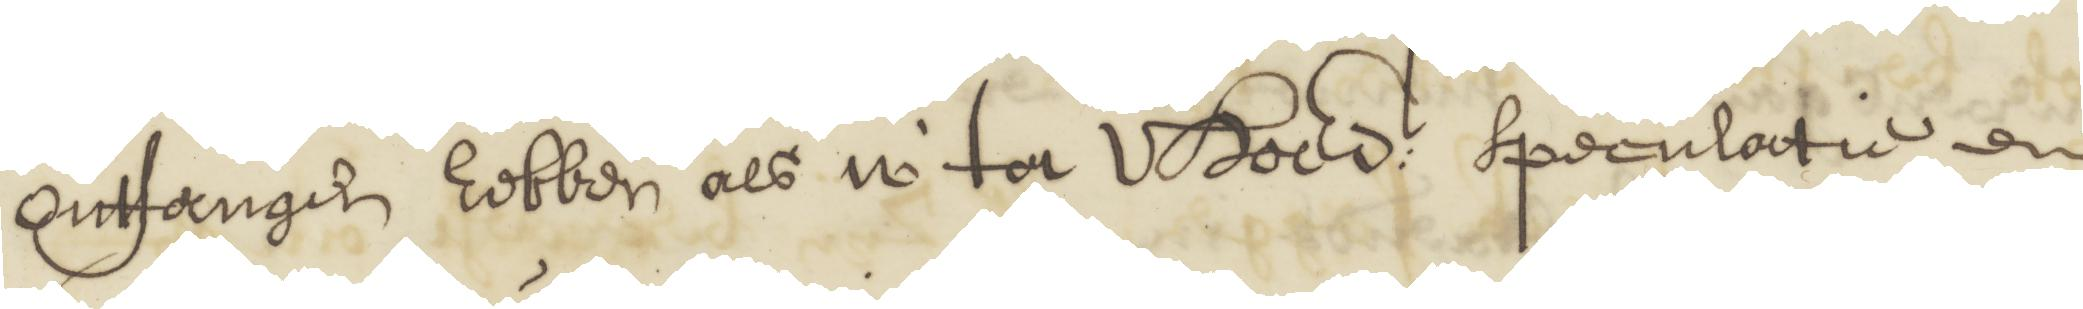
ontfangen hebben als w' tot vHoEd: speculatie en
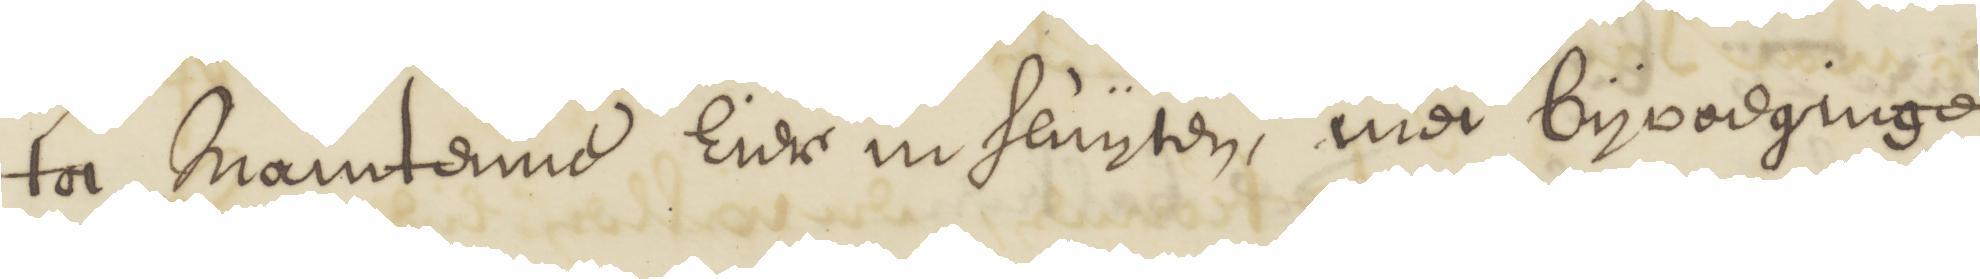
tot maintenue hier in sluijten, met bijvoeginge
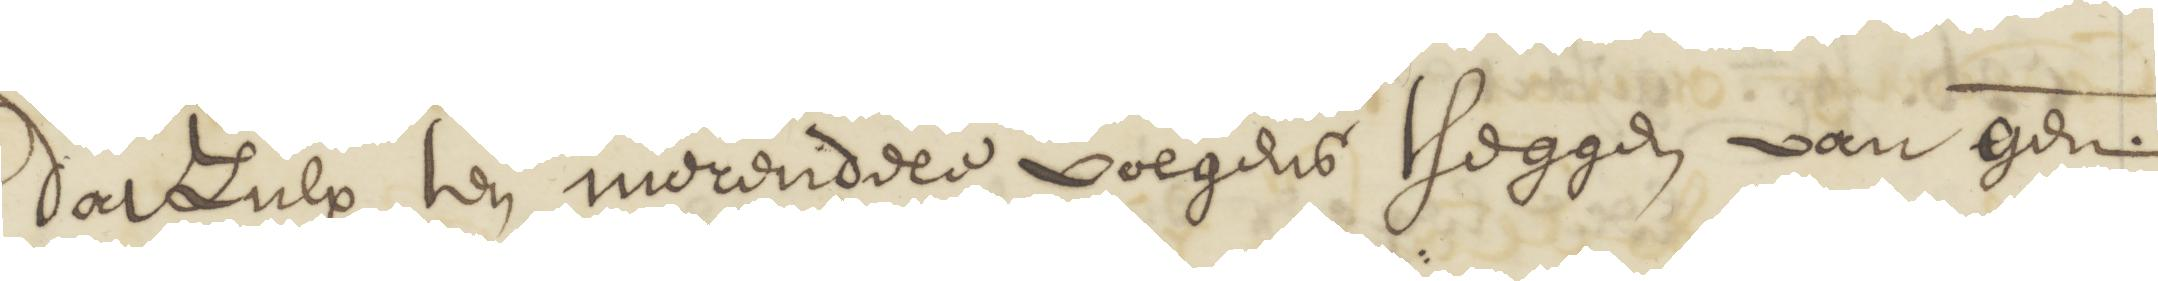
dat zulx ten merendele volgens tseggen van gen.
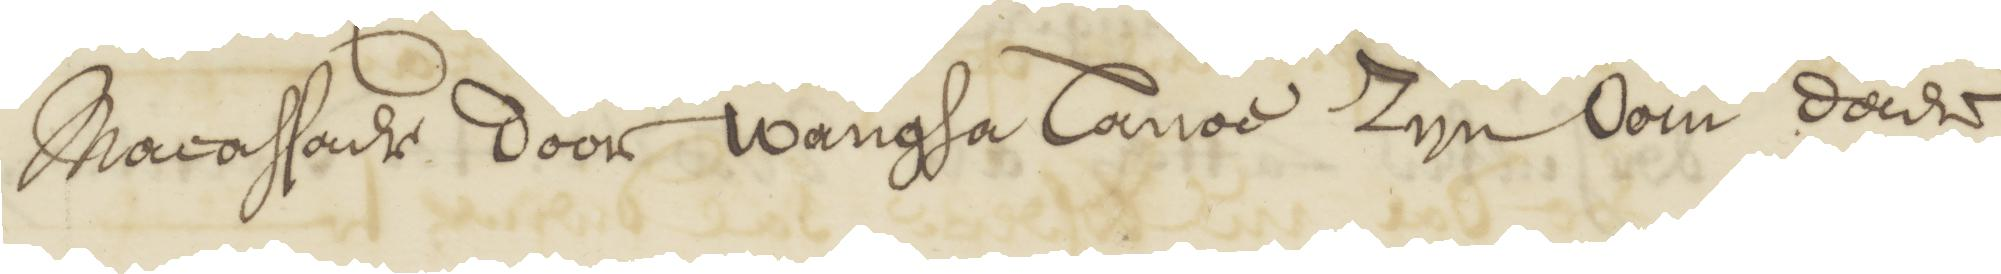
Macassaer door wangsa Canoe zijn Oom daer
